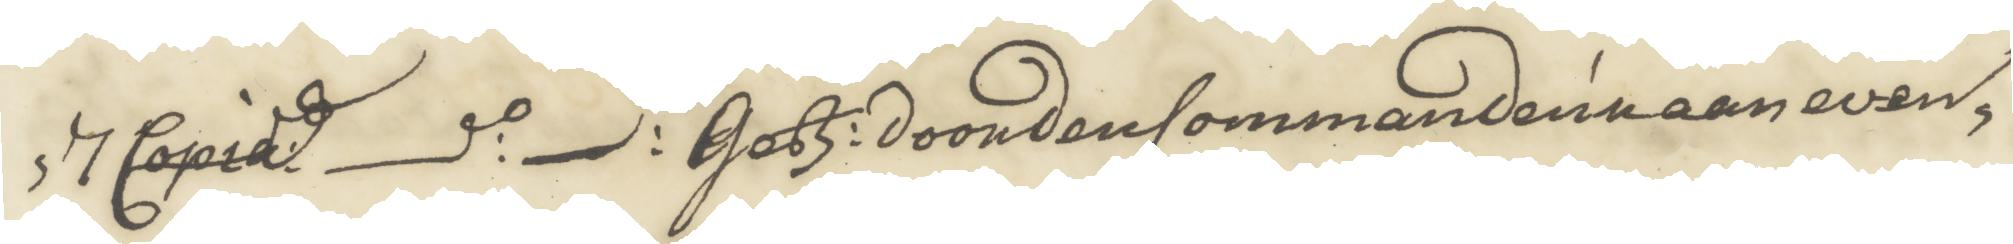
„ 7 Copia_:o _:o _:o gesz: door den Commandeur aan even„
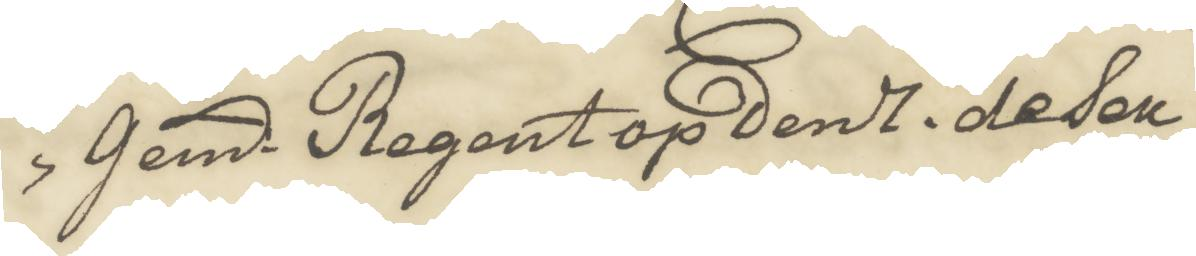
„gem: Regent op den 7.' deser
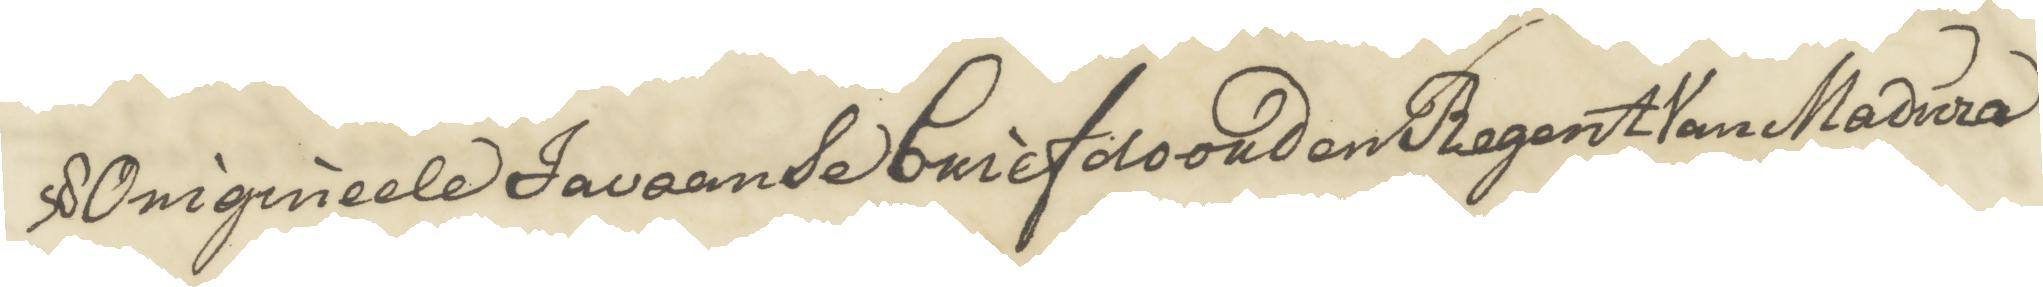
8 Origineele Javaanse brief door den Regent van Madura
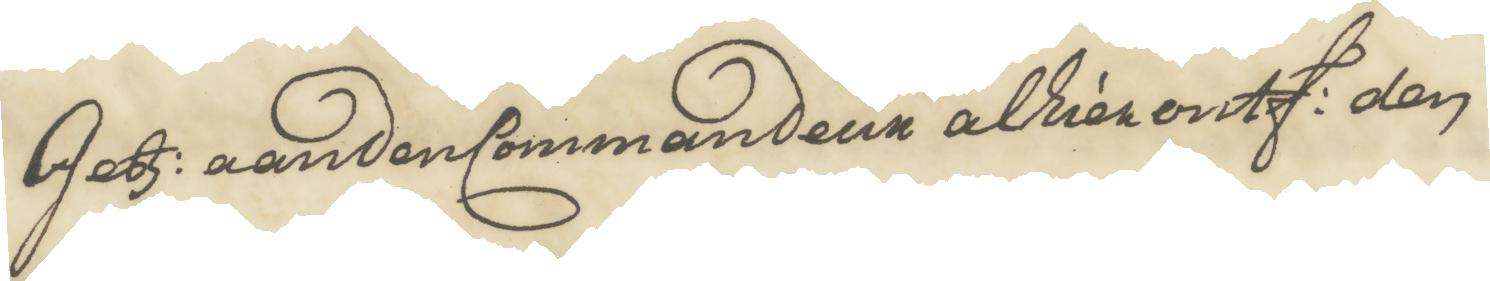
Gesz: aan den Commandeur alhier ontf: den
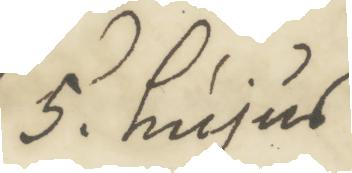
5.' hujus
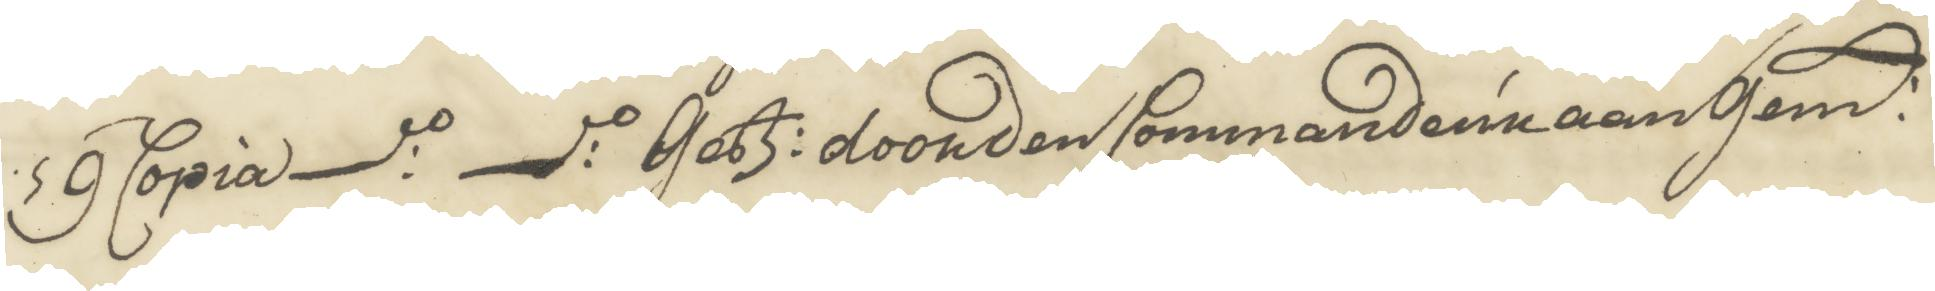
„ 9 Copia _:o _:o Gesz: door den Commandeur aan gem:
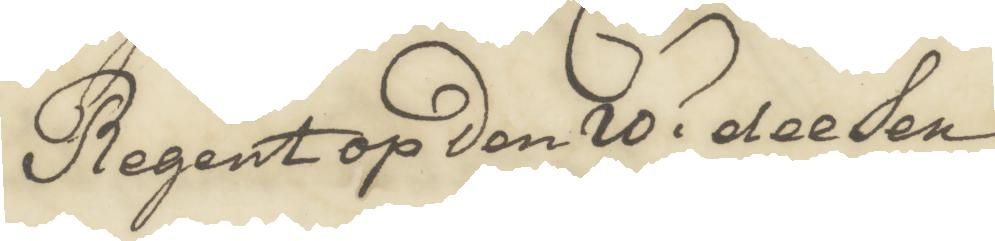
Regent op den 10.' deeser
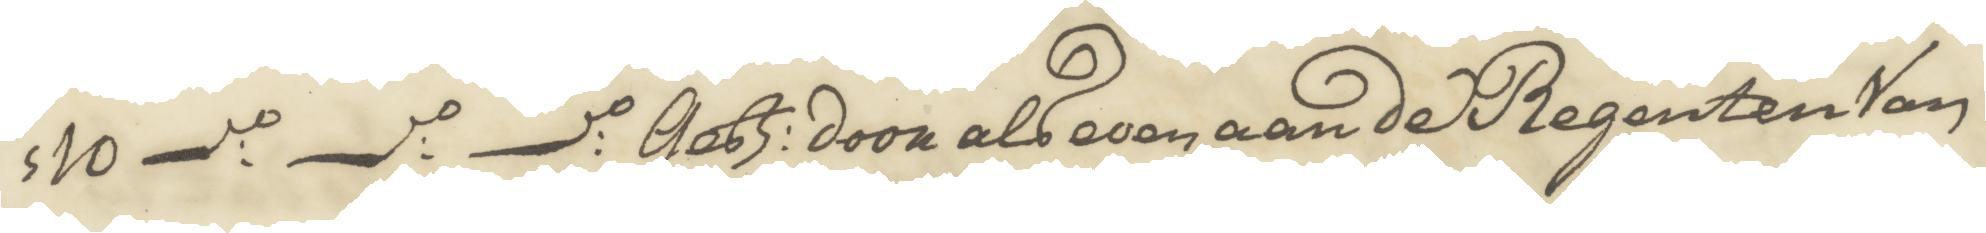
„ 10 _:o _:o _:o Gesz: door als even aan de Regenten van
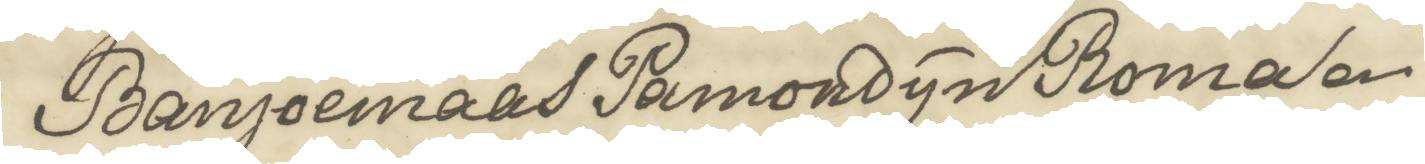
Banjoemaas Pamondijn Roma en
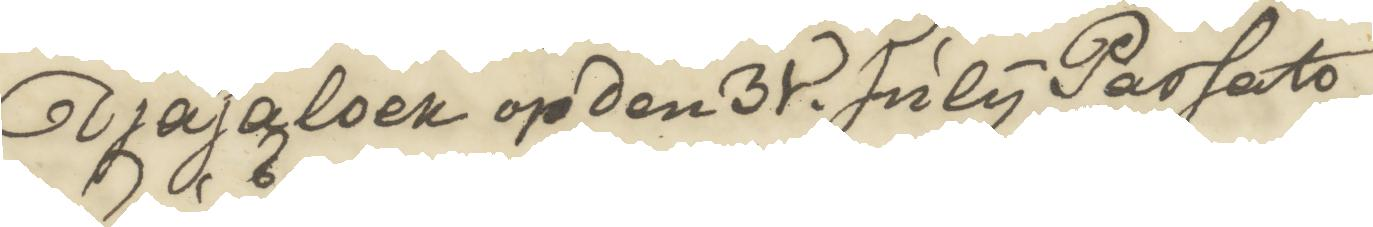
djajaloer op den 31.' Julij Passato
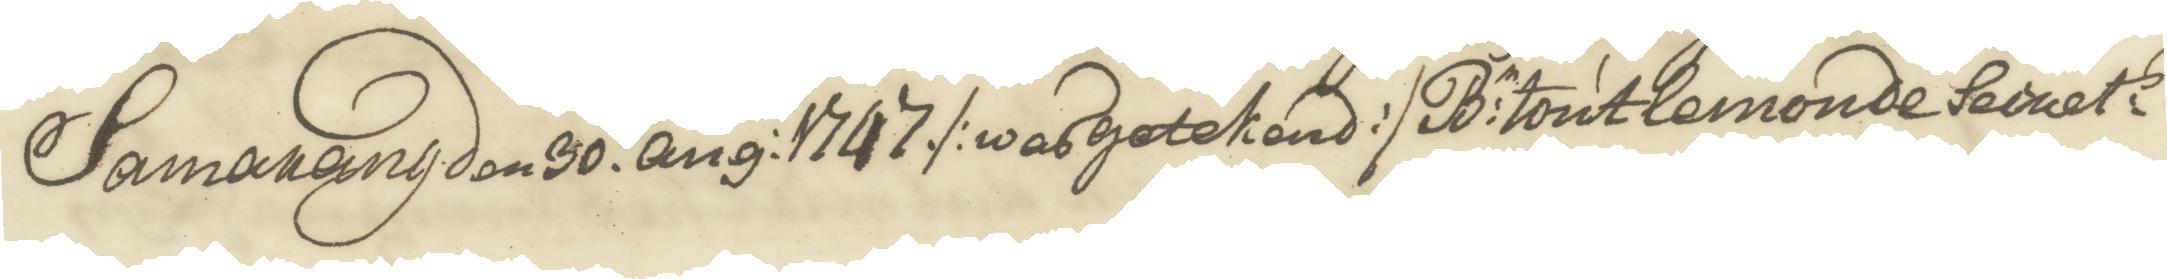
Samarang den 30.' aug:s 1747. /:was getekend:/ B:n tout lemonde secret:s
